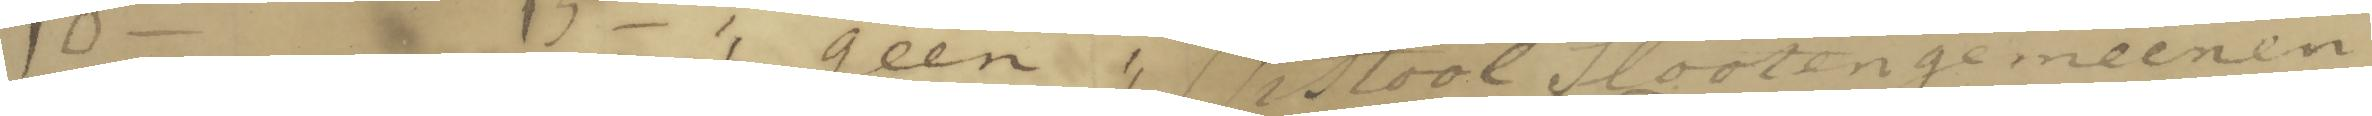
10 — 15 — „ geen „ Pistool slooten gemeenen
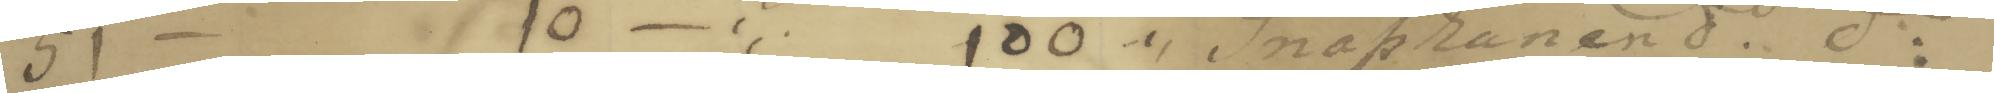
51 — 10 — „ 100 „ snaphanen d:o d:o
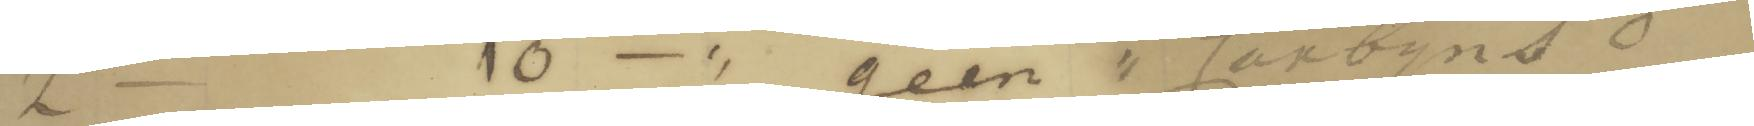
2 — 10 — „ geen „ Carbijns do
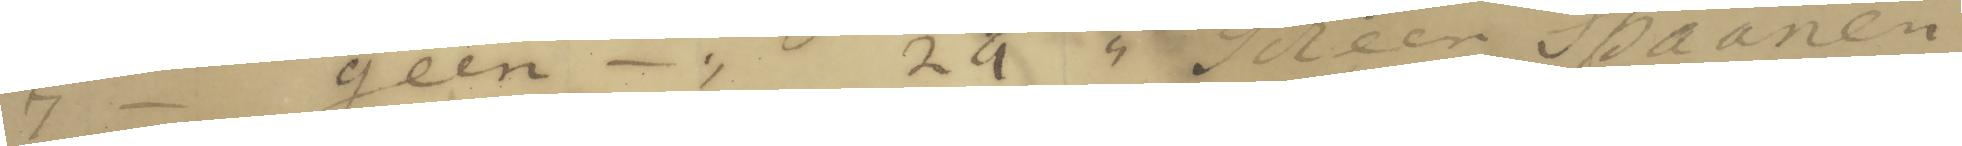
7 — geen — „ 24 „ scheer spaanen
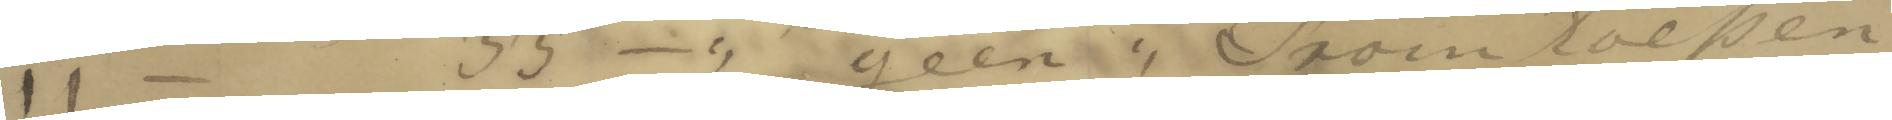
11 — 33 — „ geen „ Trom hoepen
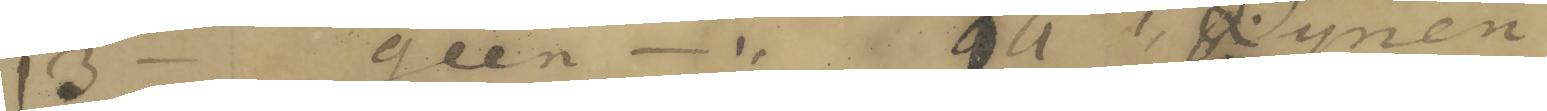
13 — geen — „ 44 „ d:o synen
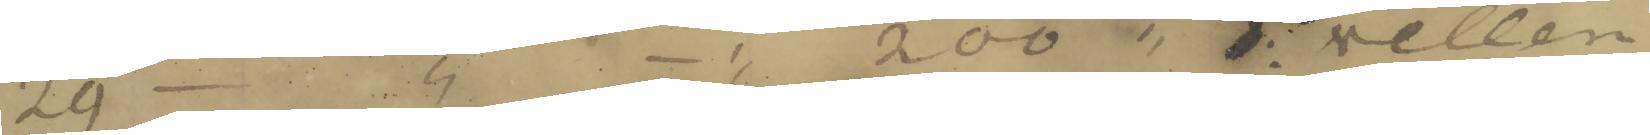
29 — „ — „ 200 „ d:o vellen
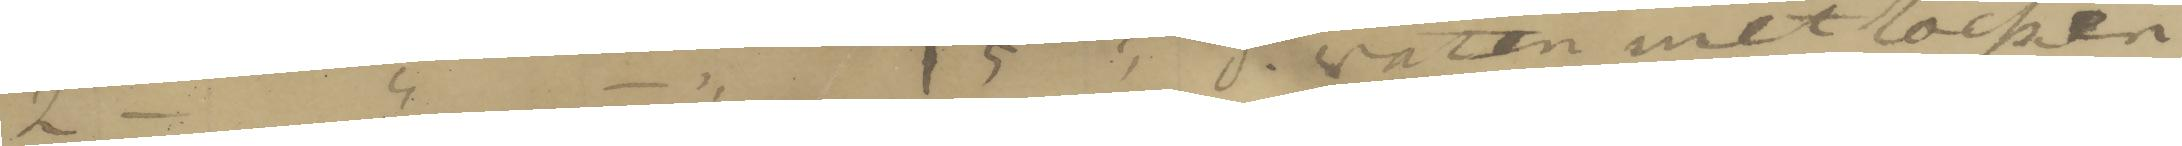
2 — „ — „ 15 „ d.o vaten met hoepen
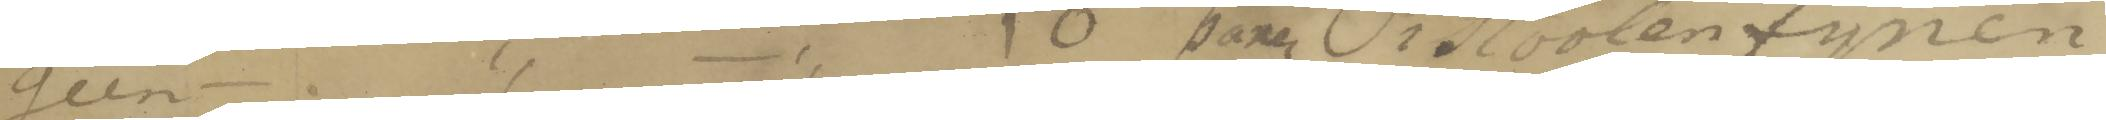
geen — „ — „ 10 paren Pistoolen fynen
